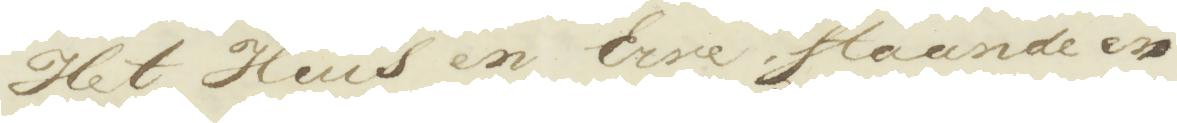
Het Huis en Erve, staande en
